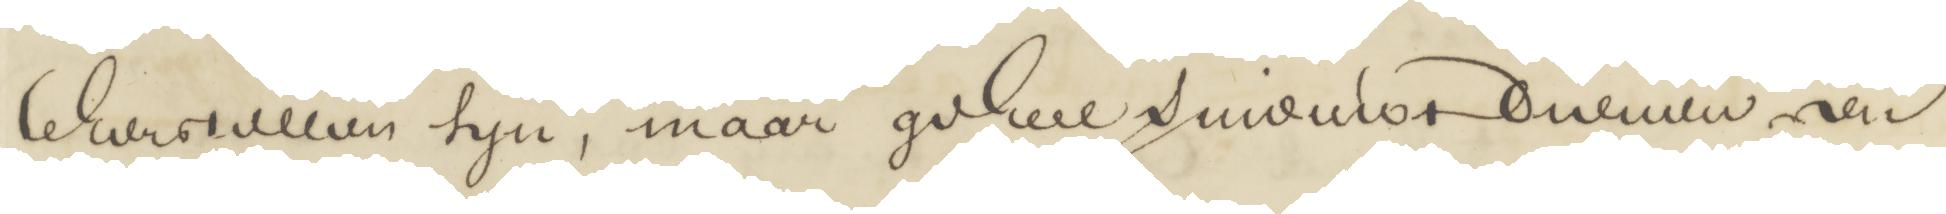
te herstellen sijn, maar geheel vernieuwt dienen en
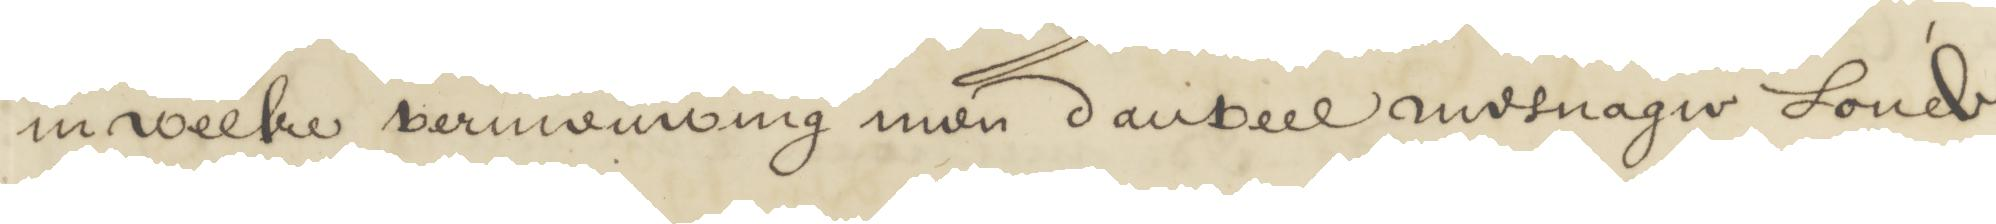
in welke vernieuwing men dan veel mesnagie Soude
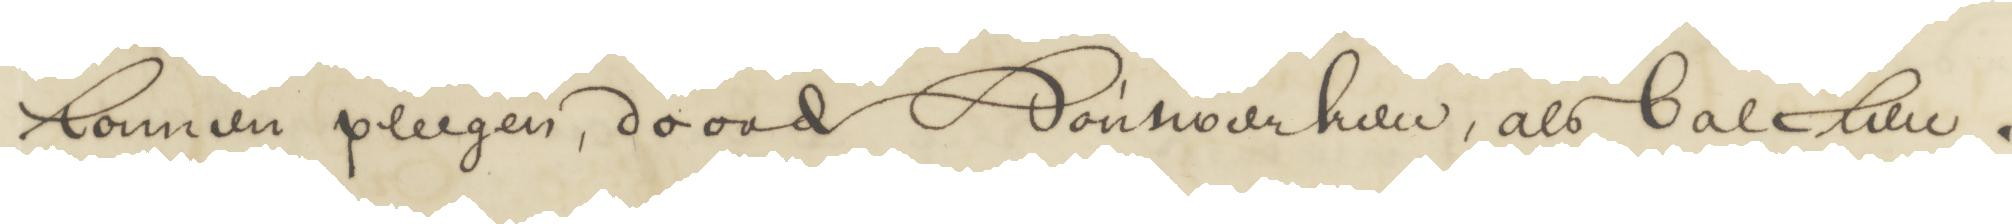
konnen pleegen, door de Houtwerken, als balcken,
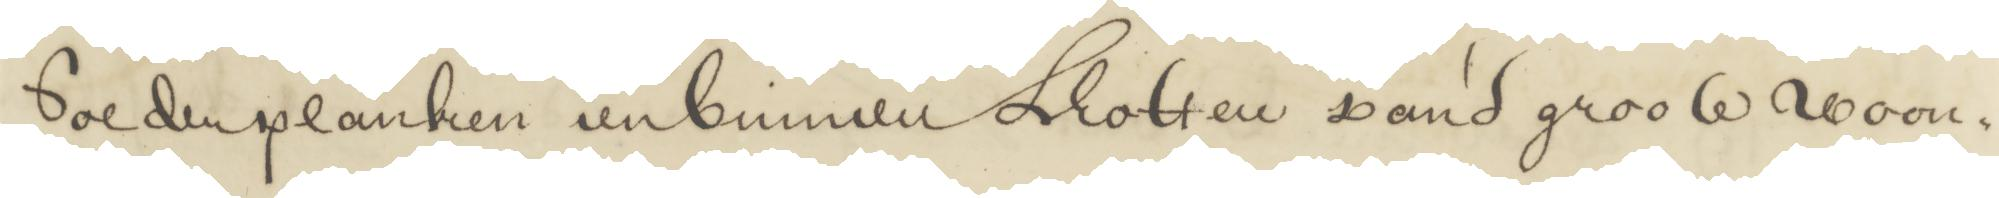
Solderplanken en binnen Schotten van't groote woon„
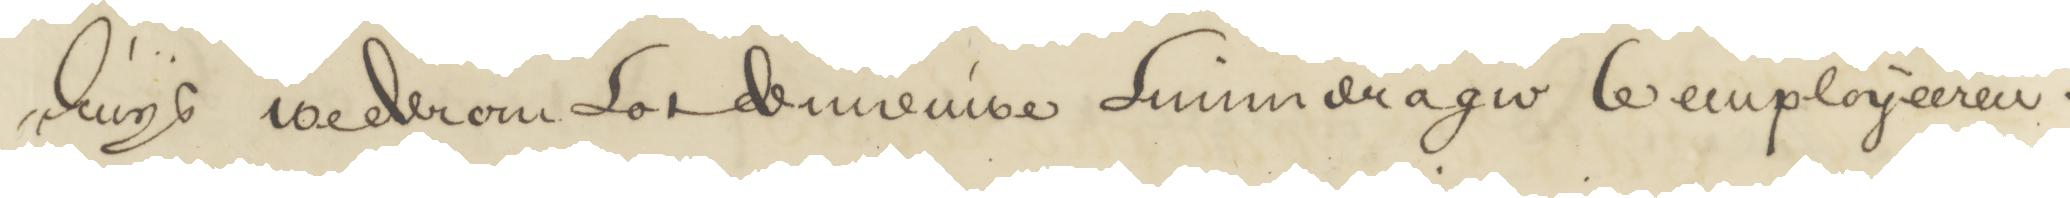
„huijs wederom tot de nieuwe timmeragie te emploijeeren
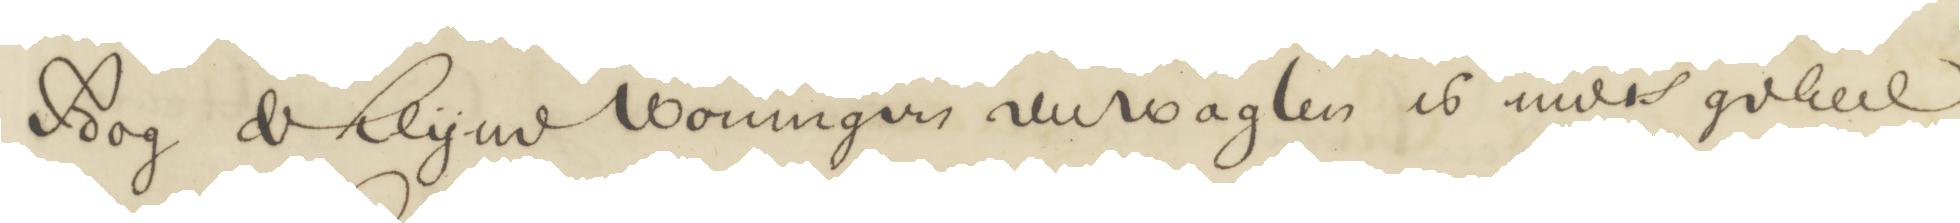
Edog de klijne woningen en wagten is niets geheel
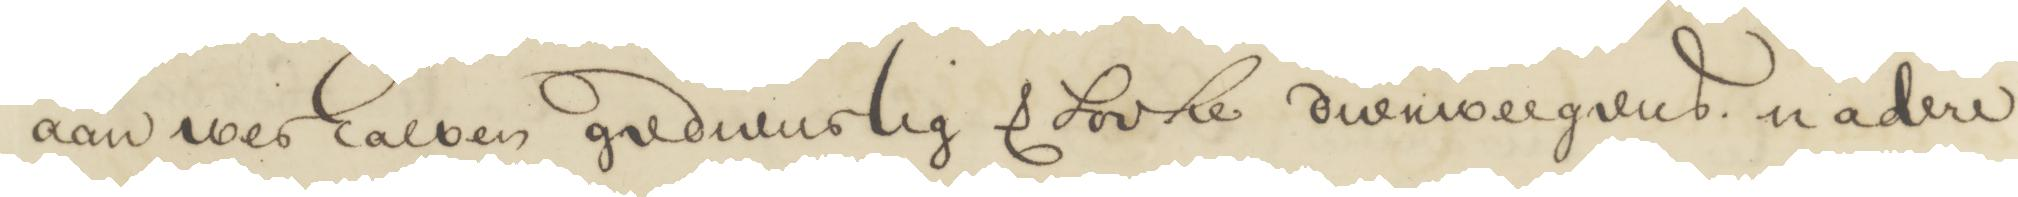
aan weshalven gedienstig versoek dierweegens. nadere
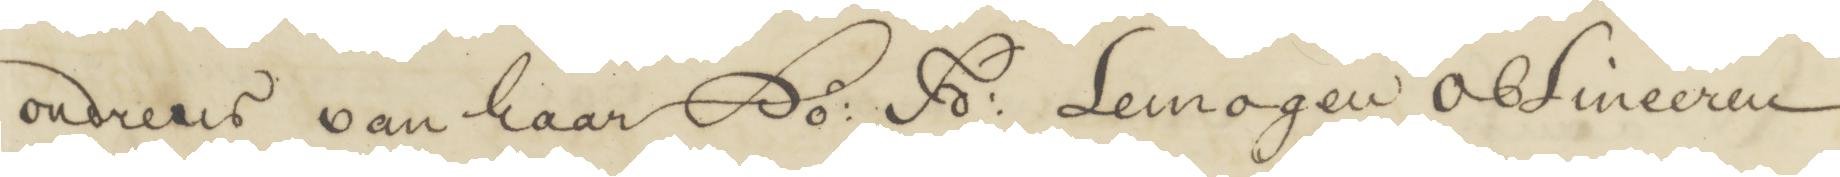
ordrens van haar Ho: Ed: temogen obtineeren
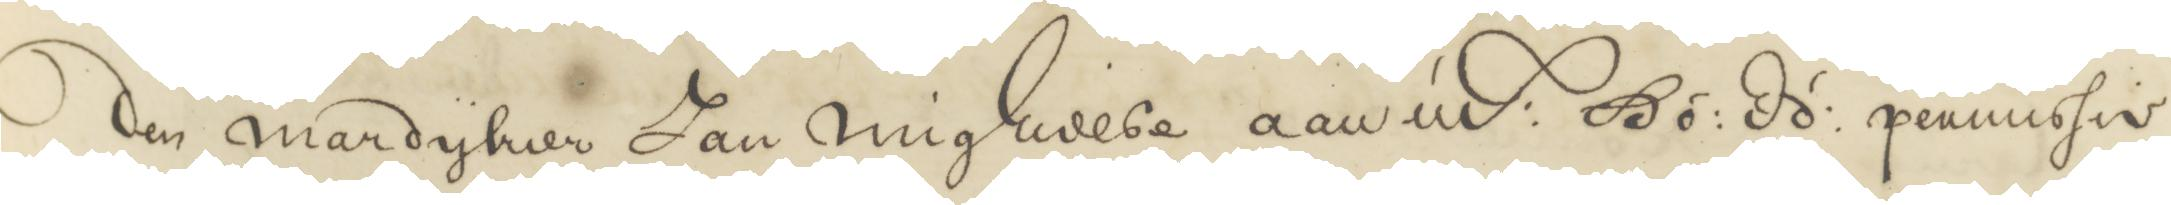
den mardijker Ian mighielse aan uE: Ho: Ed: permissie
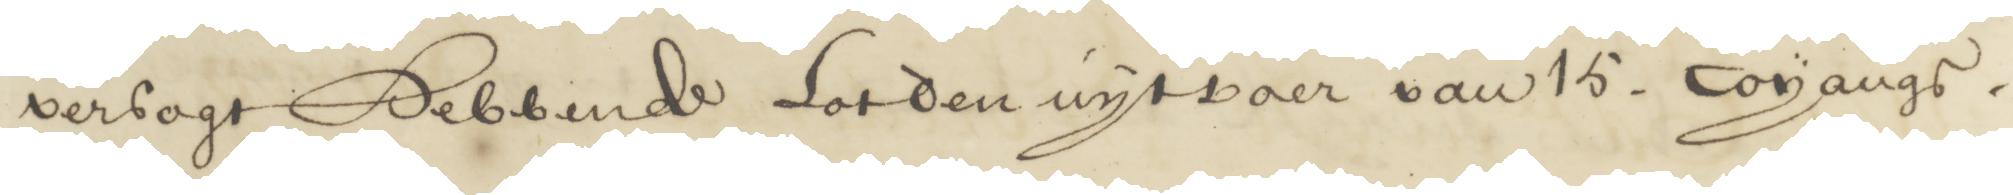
versogt Hebbende tot den uijtvoer van 15. coijangs -
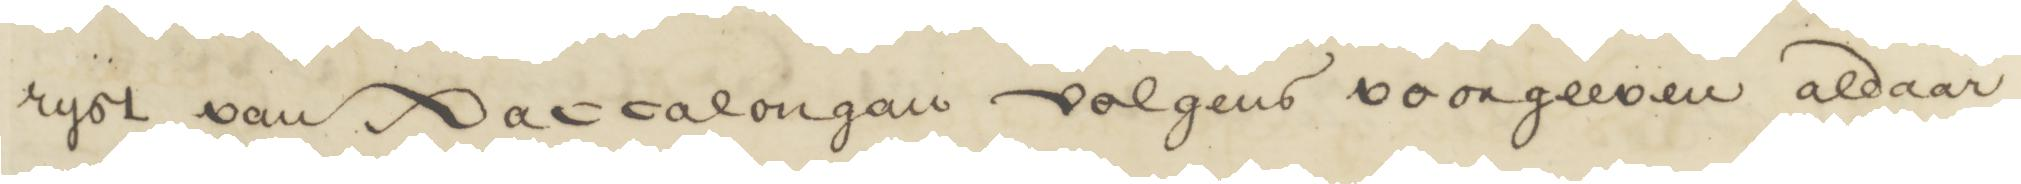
rijst van Paccalongan volgens voorgeeven aldaar
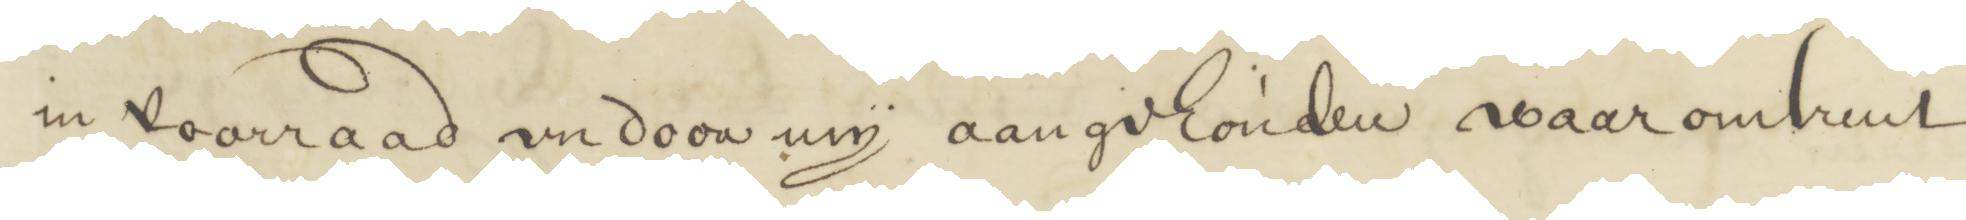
in voorraad en door mij aangehouden waar omtrent
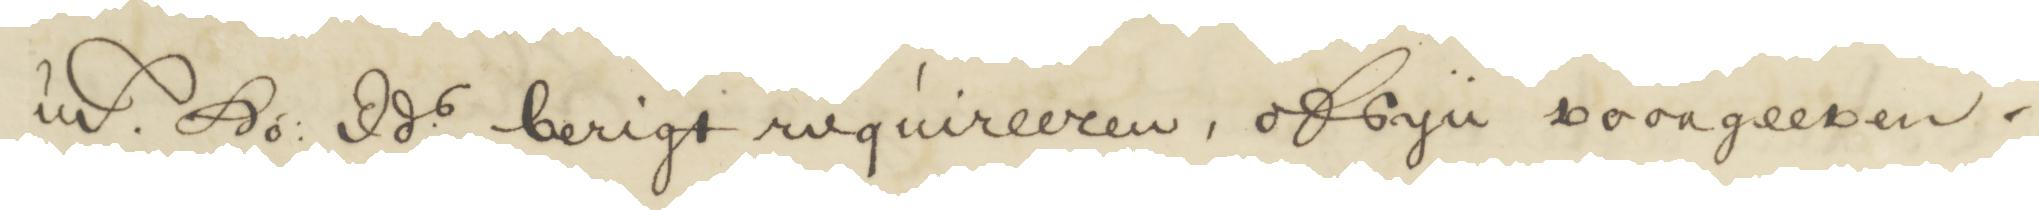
uE: Ho: Ed:s berigt requireeren, of sijn voorgeeven-
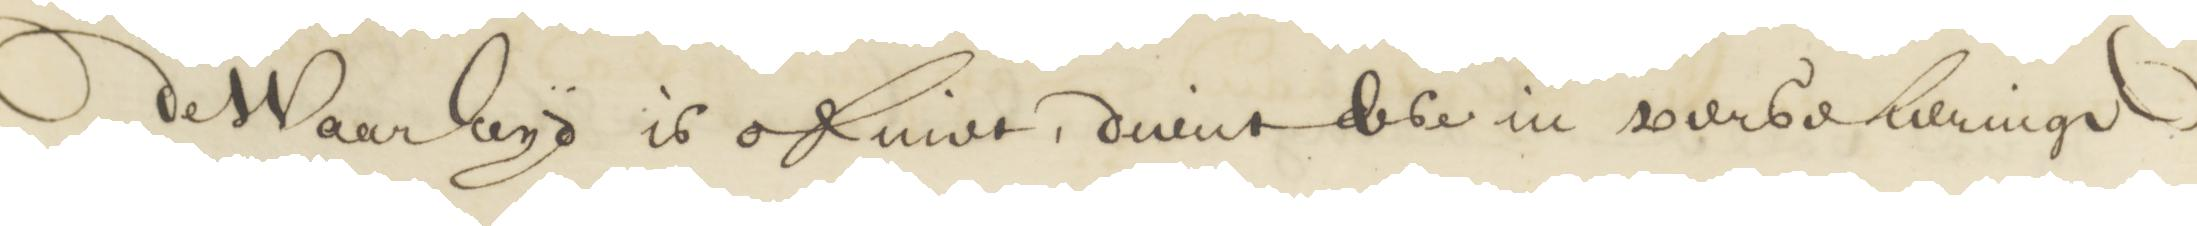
de Waarheijd is of niet, dient dese in versekeringe
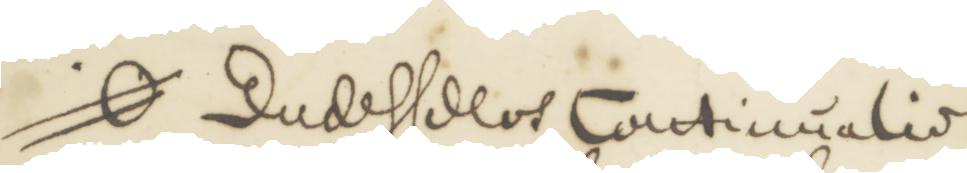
Ø In desselvs Continuatie
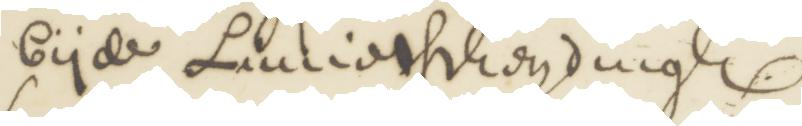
bij de Limiet scheydingh
